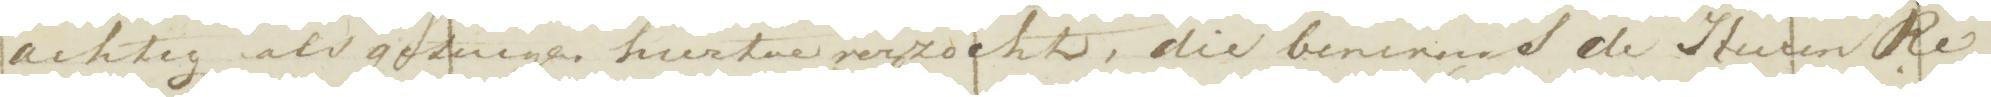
achtig als getuigen hiertoe verzocht, die benevens de Heeren Re
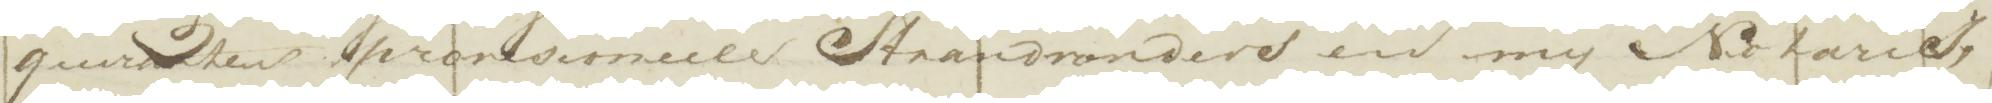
quiranten provisioneele Strandvonders en mij Notaris,
